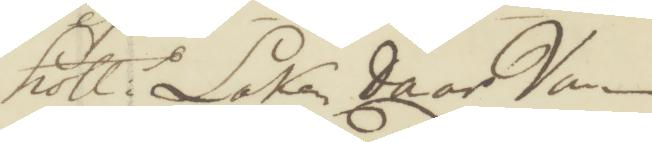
holl:s Laken daar van
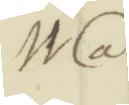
11@
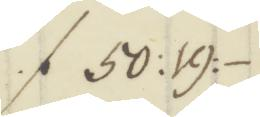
. ƒ 50:19:–
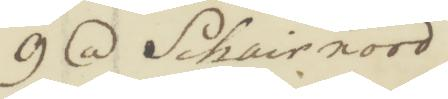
9 @ Schair rood
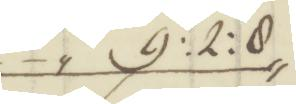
– „ 9:2:8„
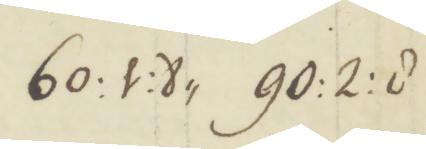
60:1:8„ 90:2:8
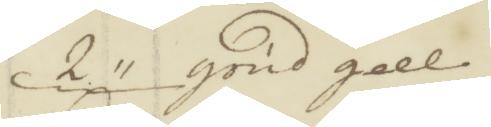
2.„ goud geel
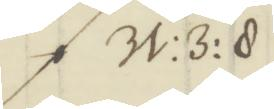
–ƒ 31:3:8
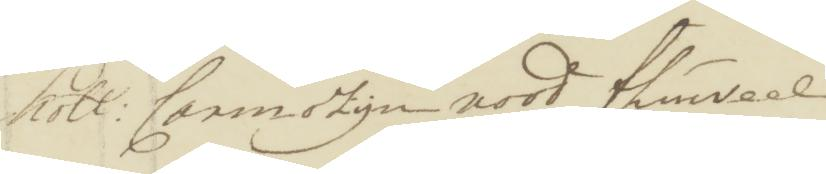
holl: Carmozijn root fluweel
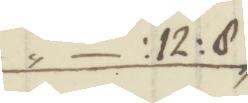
„ — :12:8
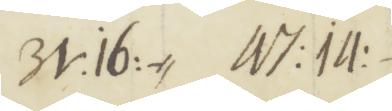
31.16:-„ 47:14:
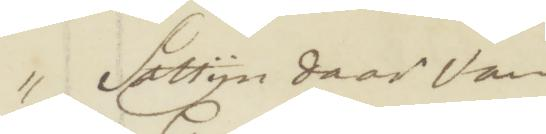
„ Sattijn daar van
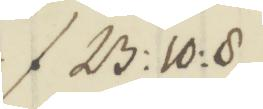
ƒ 23:10:8
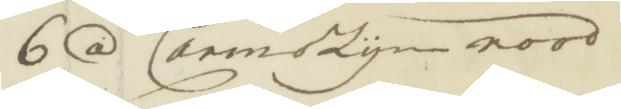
6 @ Carmozijn rood
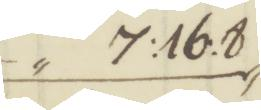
„ 7:16:8
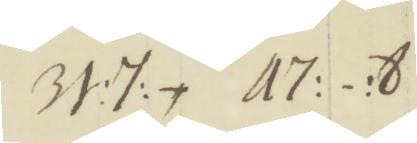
31:7: „ 47:-:8
